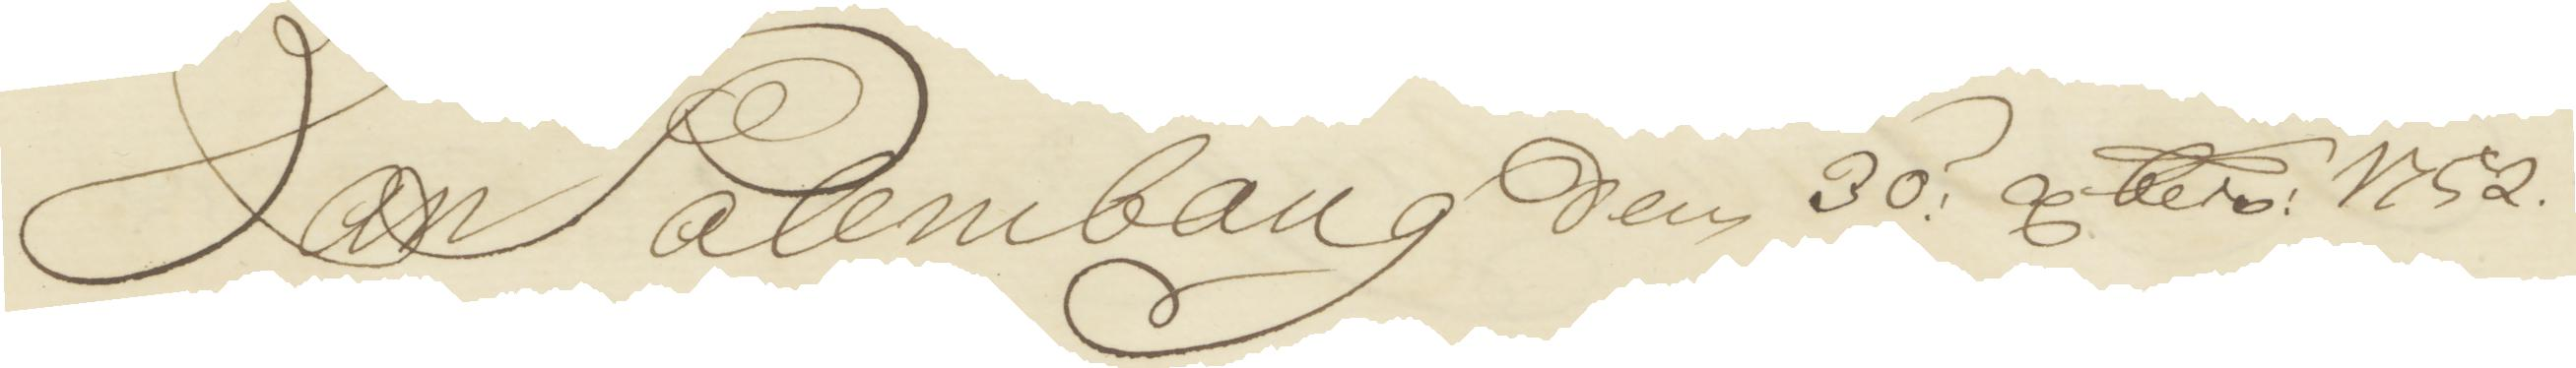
Van Palembang den 30:' xber: 1752.
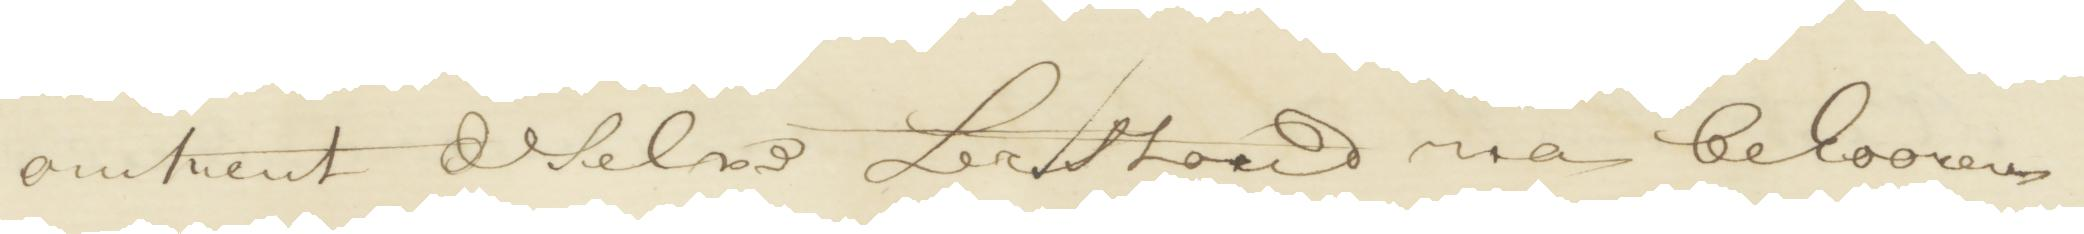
omtrent deselve tersstond na behooren
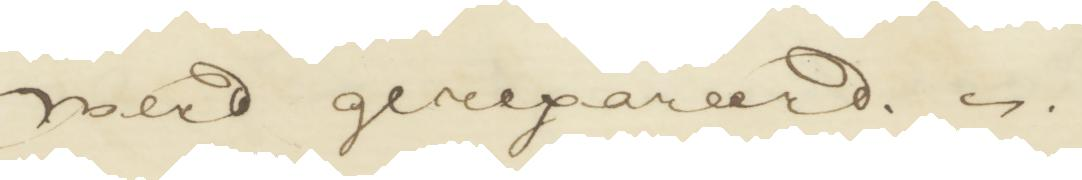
werd gerepareerd. — .
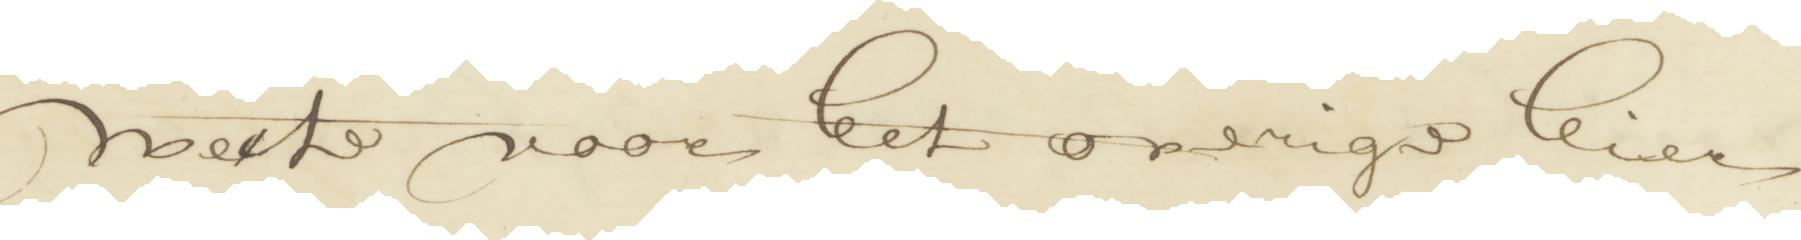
weete voor het overige hier
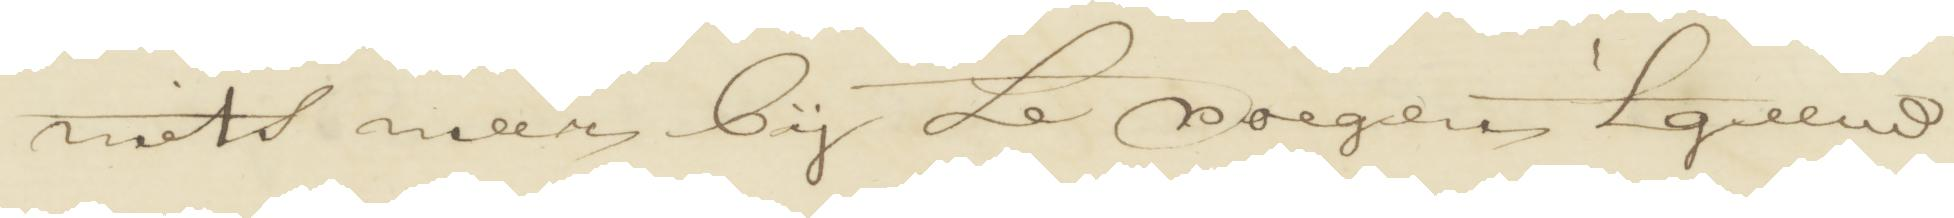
niets meer bij te voegen 'tgeene
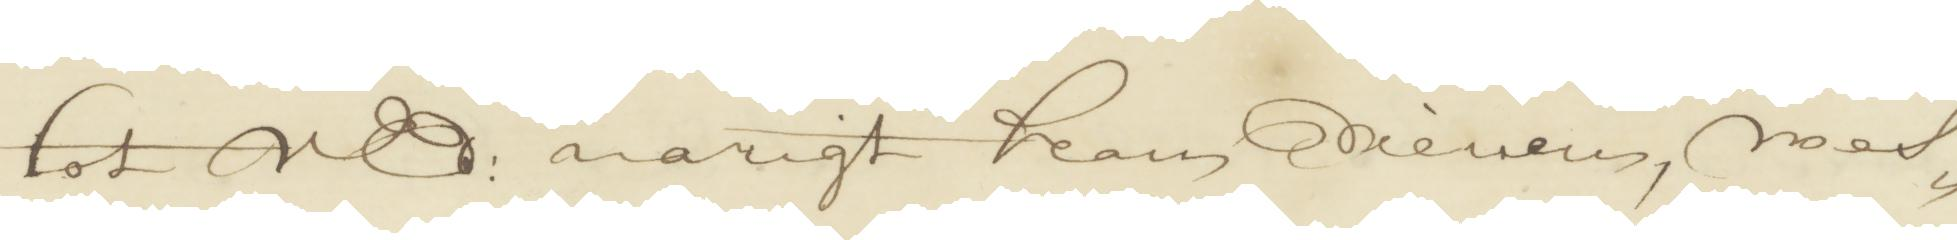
tot VEd: narigt kan dienen, wes„
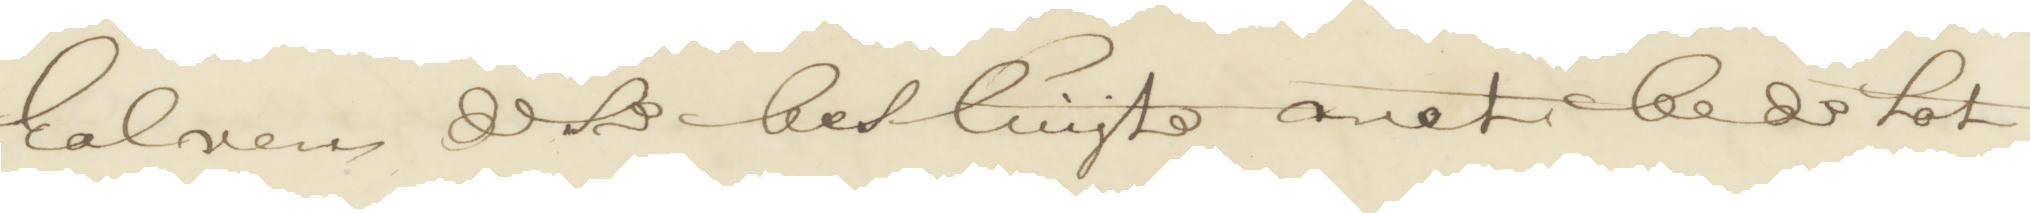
halven dese besluijte met bede tot
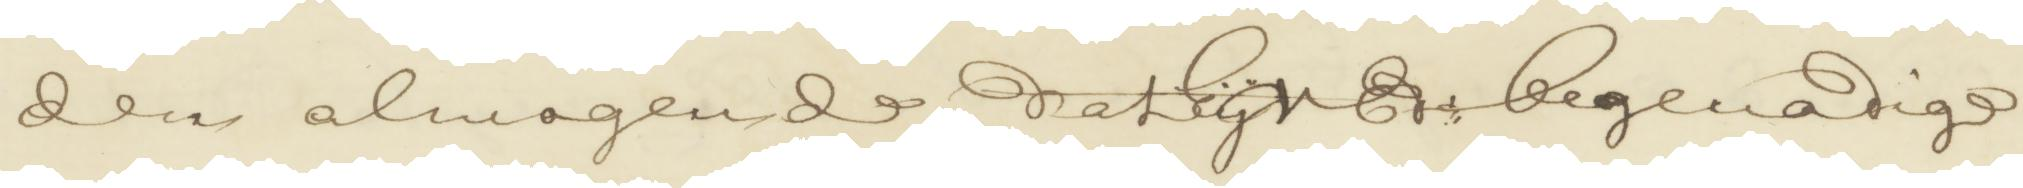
den almogende dat hij VEd: begenadige
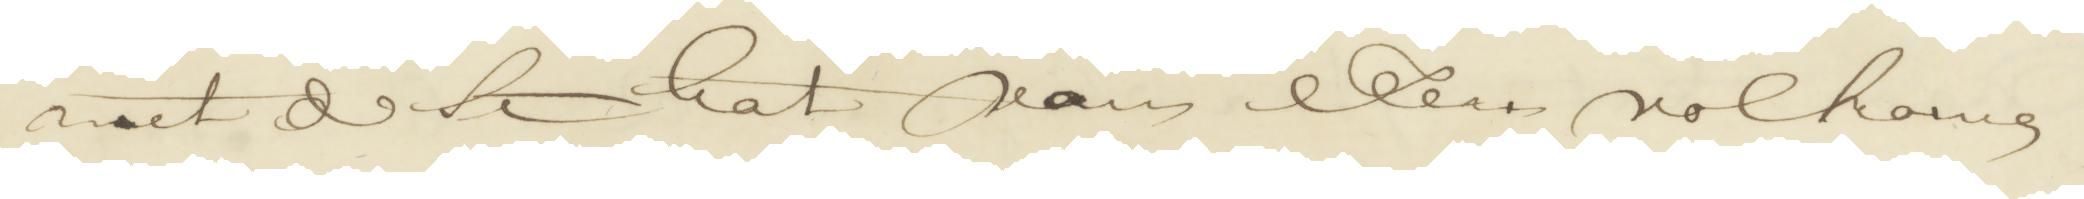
met de schat van Een volkomen
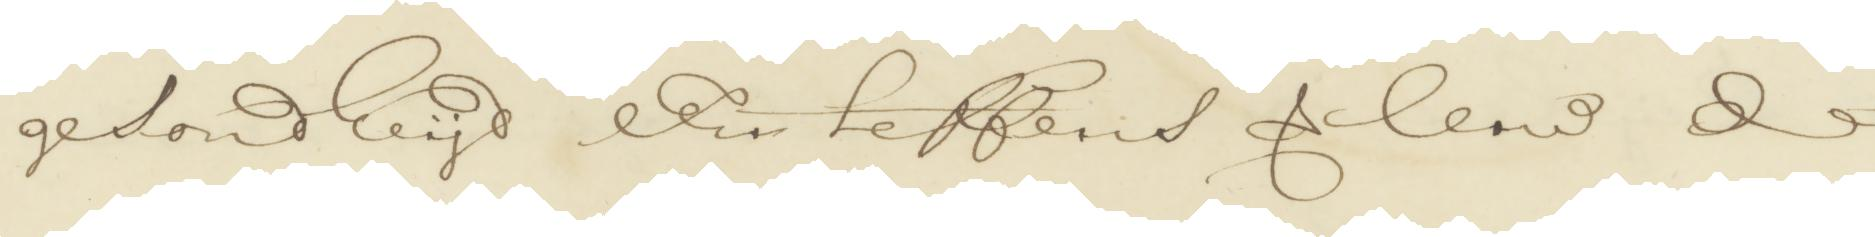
gesondheijd En teffens verlene de
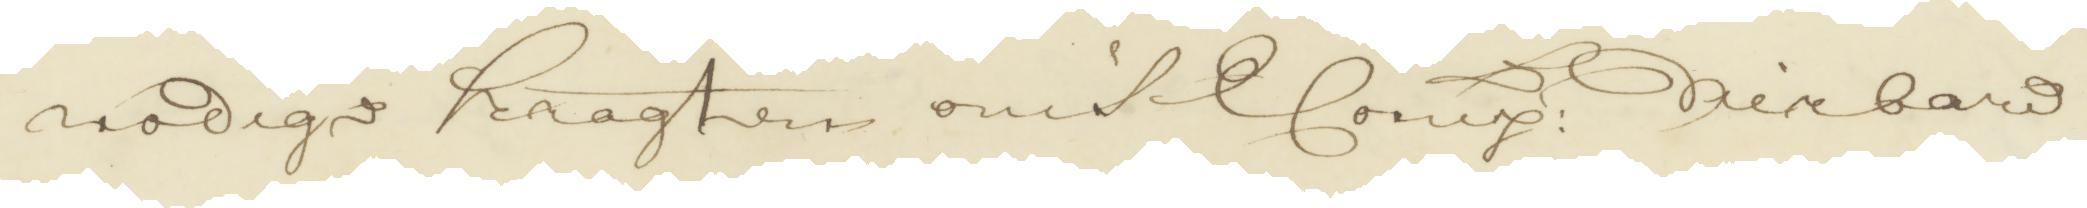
nodige kragten om 's EComp: dierbare
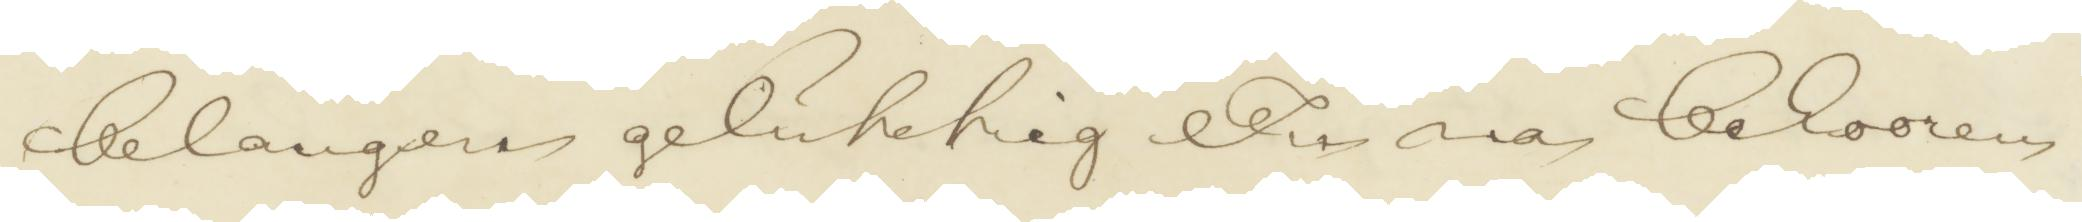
belangen gelukkig En na behooren
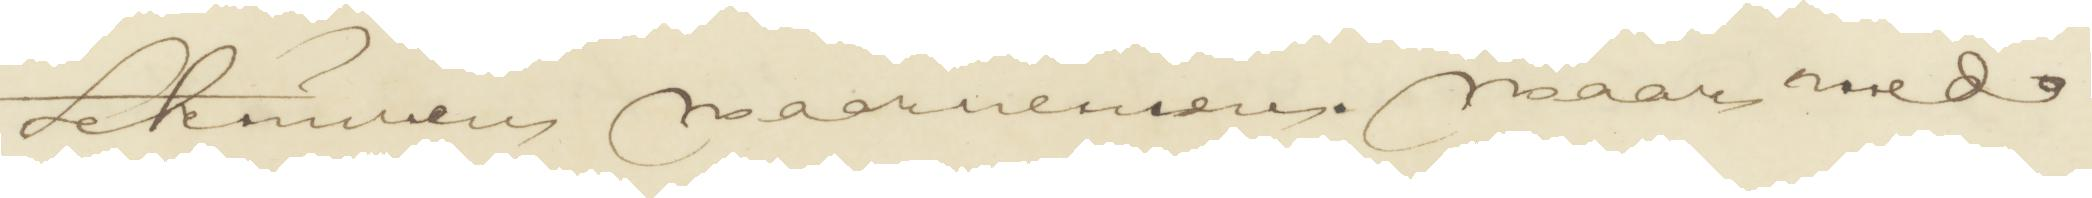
tekunnen waarnemen, waar mede
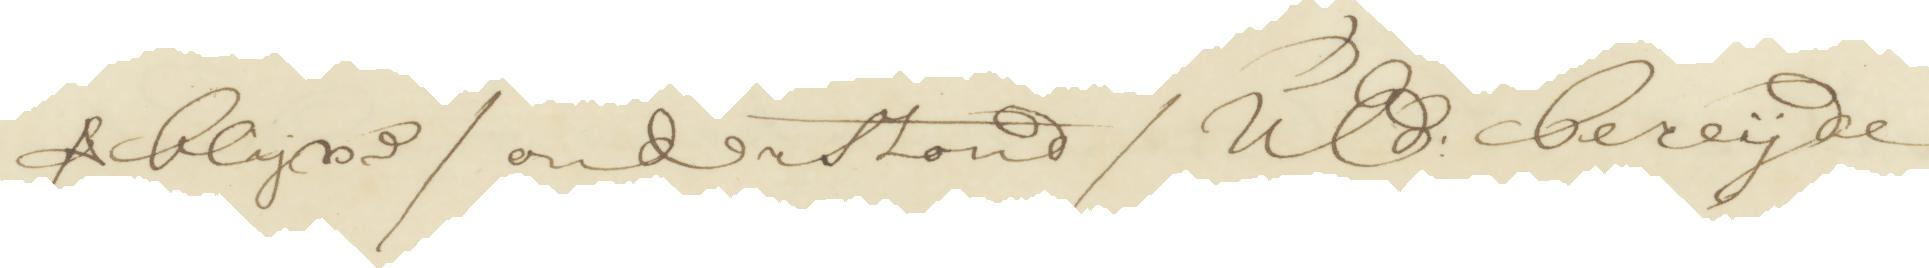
verblijve /onderstond/ UEd: bereijde
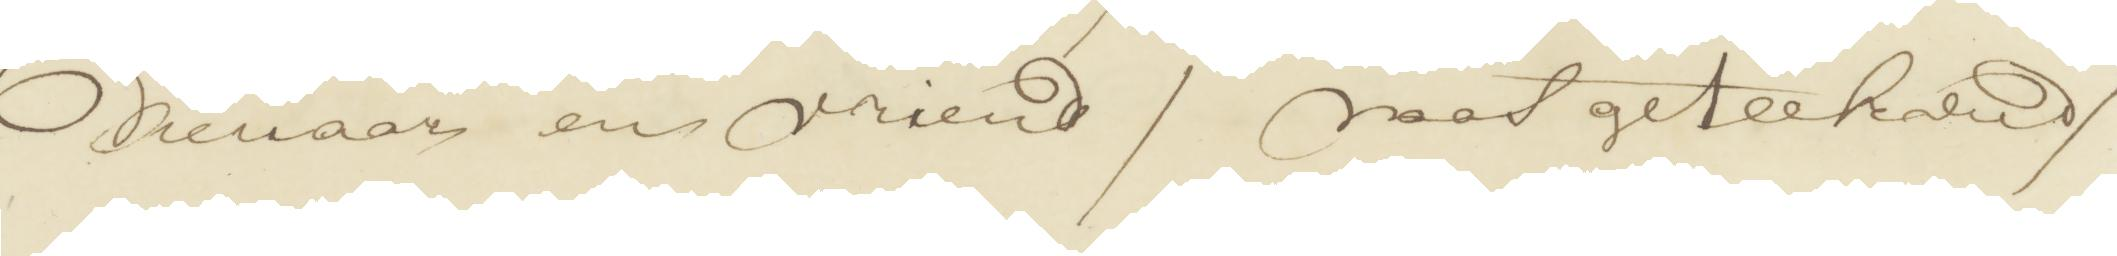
dienaar en vriend / was geteekend/
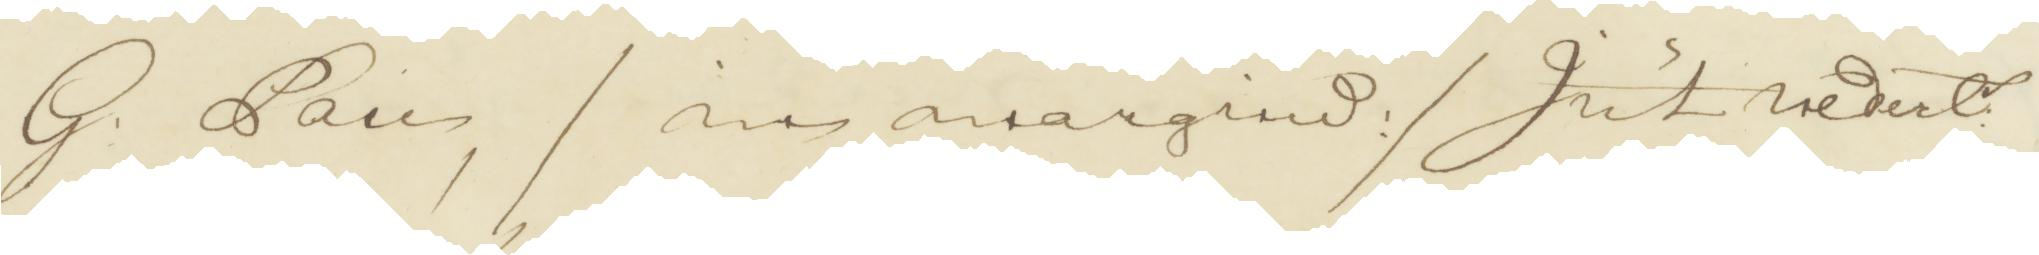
G: Pan, / in margine:/ Jn’t nederl:s
